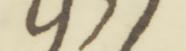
957
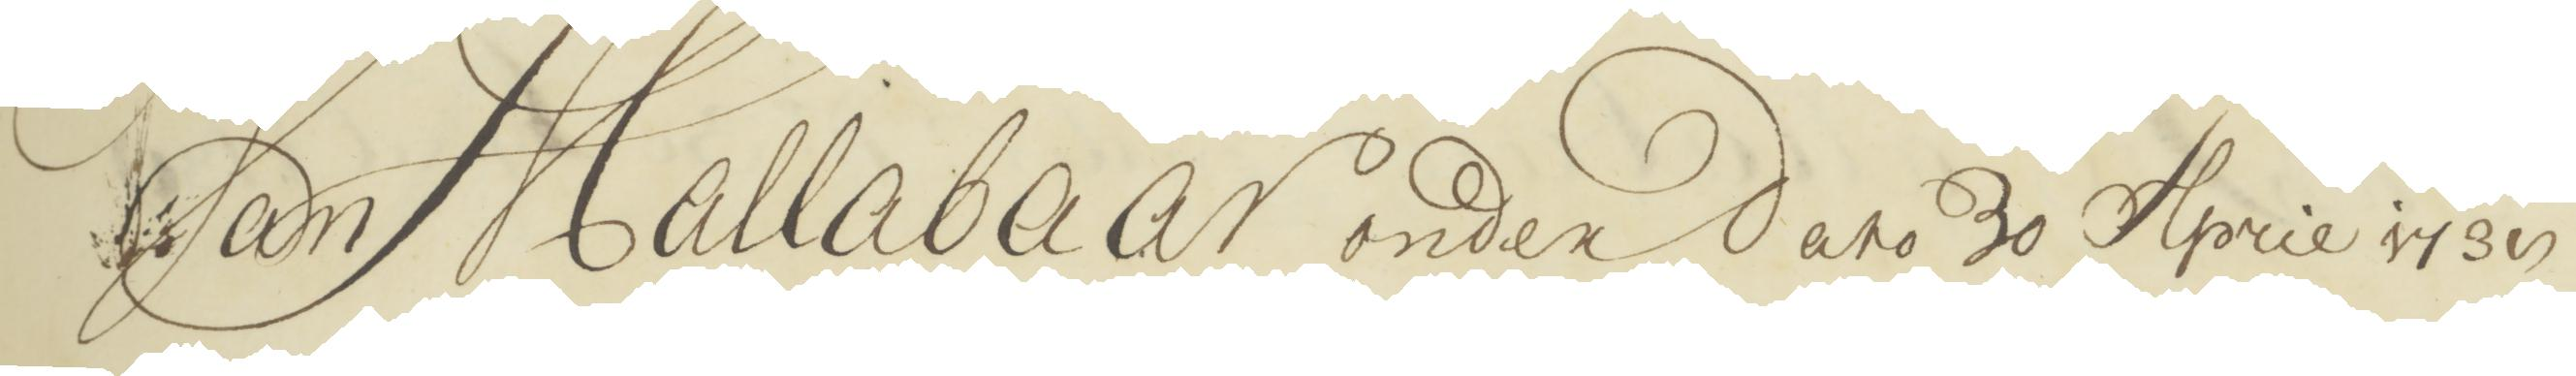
Van Mallabaar onder dato 30 April 1738
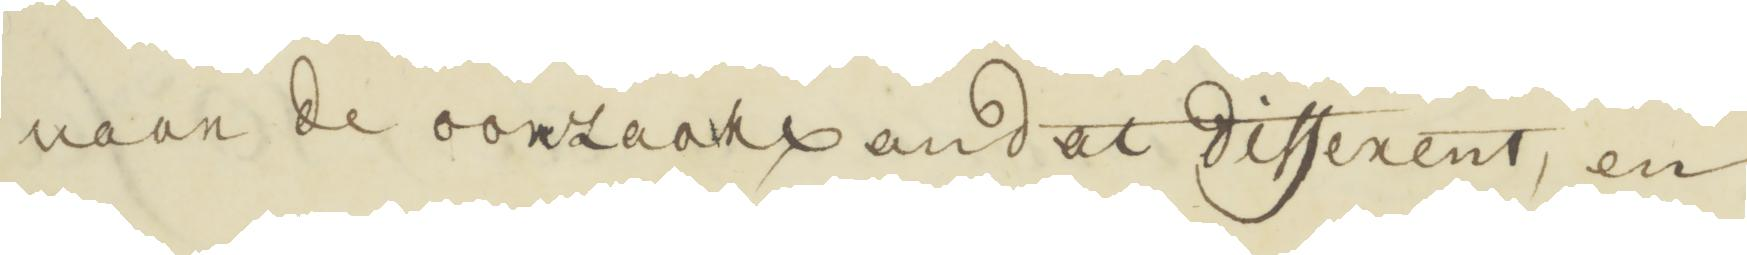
naar de oorzaak van dat different, en
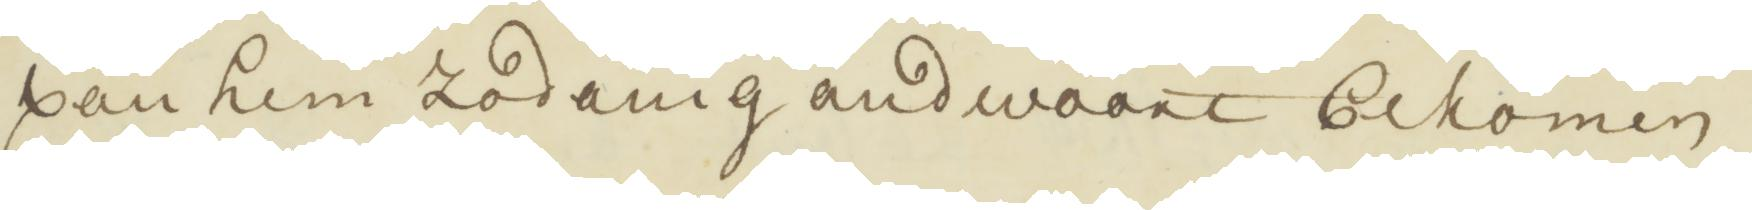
van hem zodanig andwoort bekomen
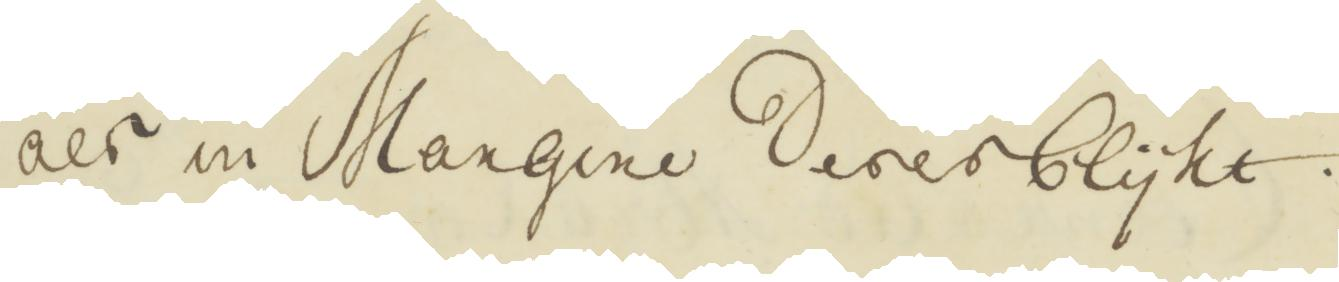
als in Margine deses blijkt.
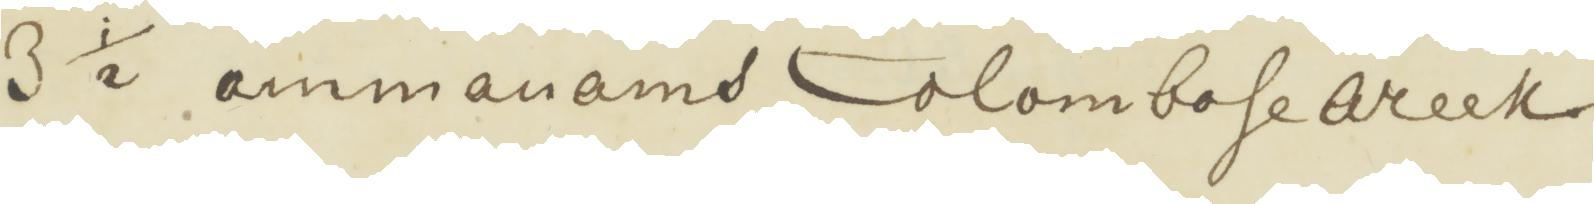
3½ ammanams Colombose areek
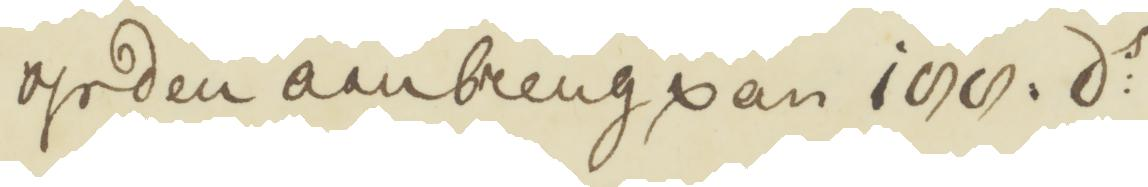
op den aanbreng van 188: d:s
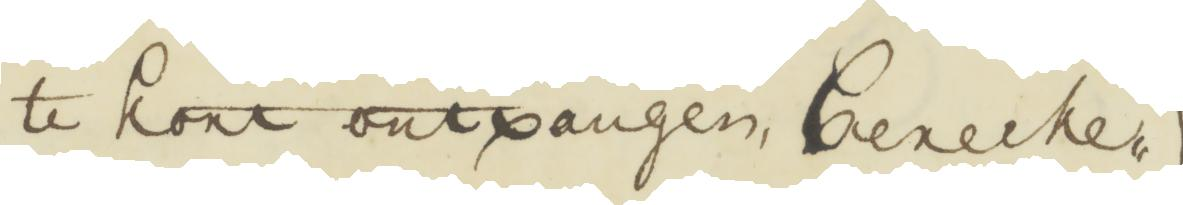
te kort ontvangen, bereeke„
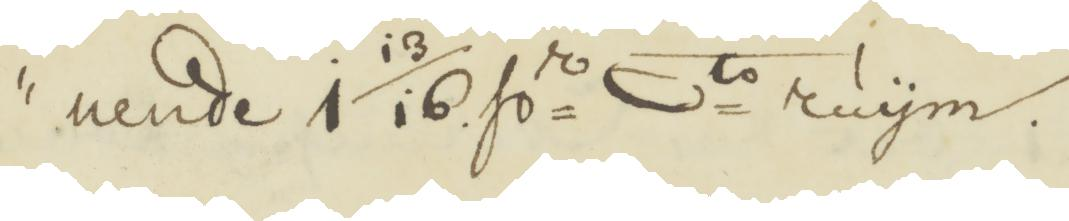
„nende 1 13/16. p=r C=to ruijm.
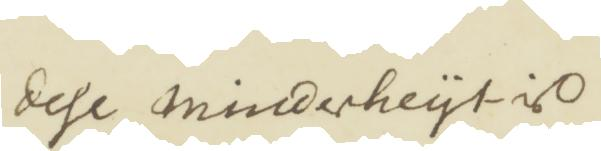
dese minderheijt is
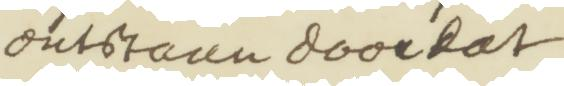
ontstaan door dat
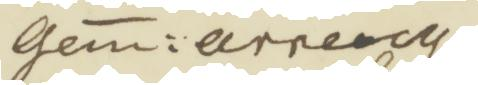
gem: arreecq
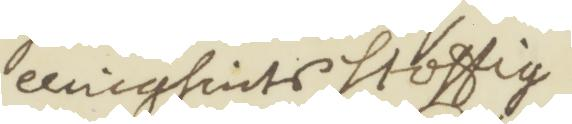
eenigsints stoffig
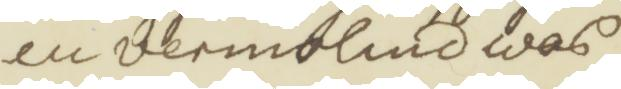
en vermolmd was
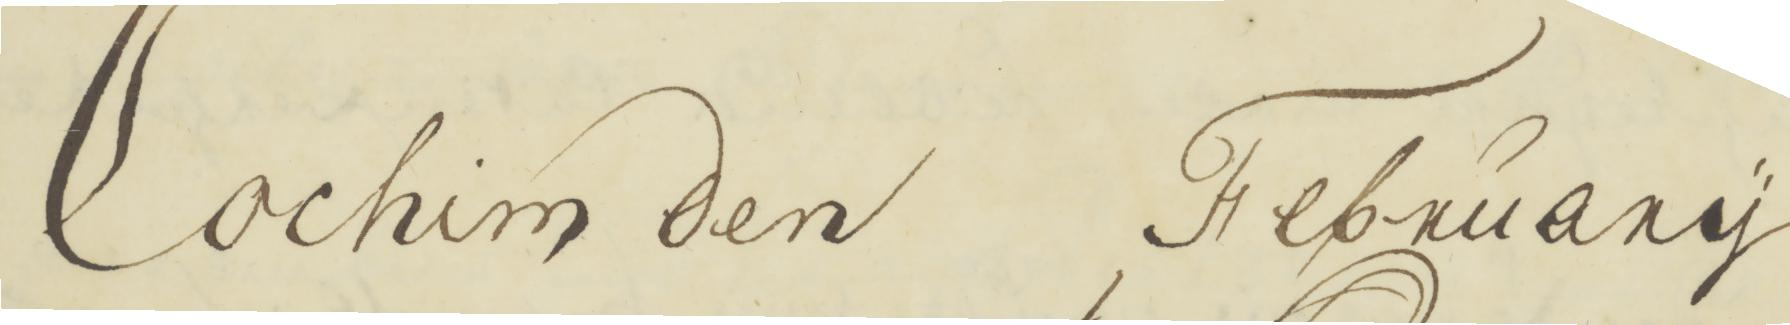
Cochim den Februarij
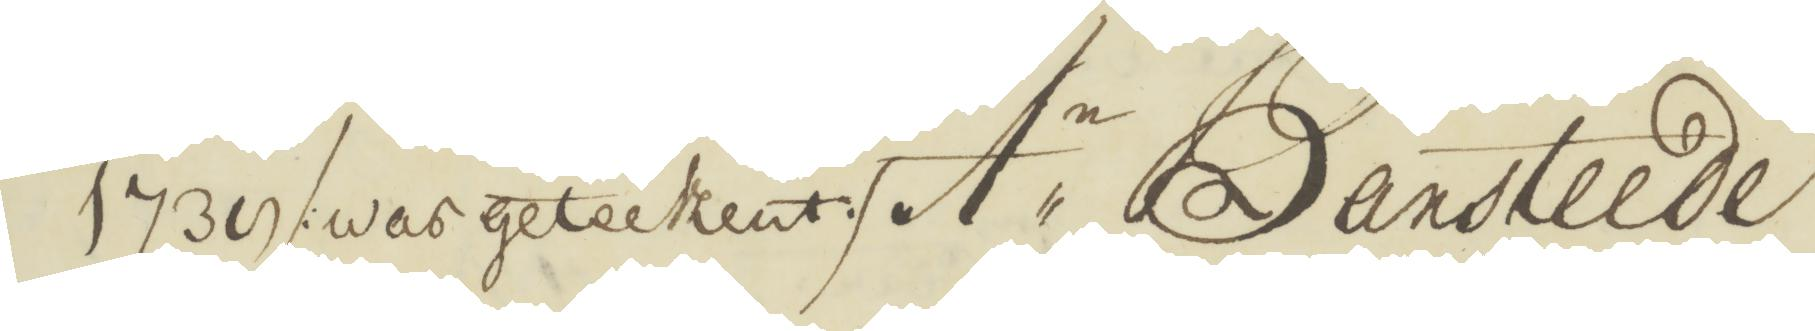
1738 /:was geteekent:/ A„n Harsteede
